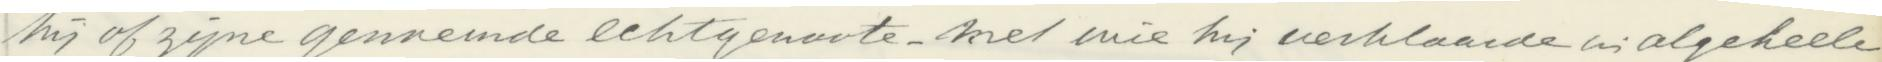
hij of zijne genoemde echtgenoote - met wie hij verklaarde in algeheele
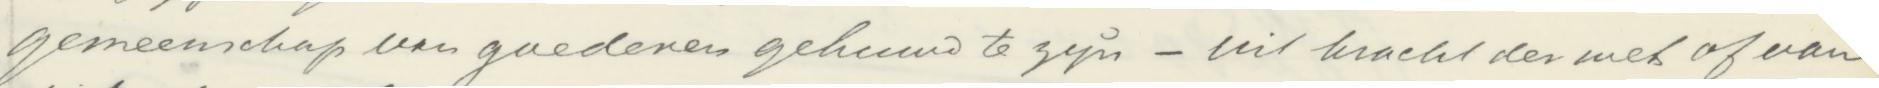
gemeenschap van goederen gehuwd te zijn - uit kracht der wet of van
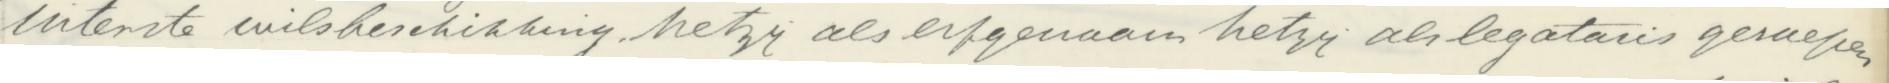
uiterste wilsbeschikking, hetzij als erfgenaam hetzij als legataris gewesen
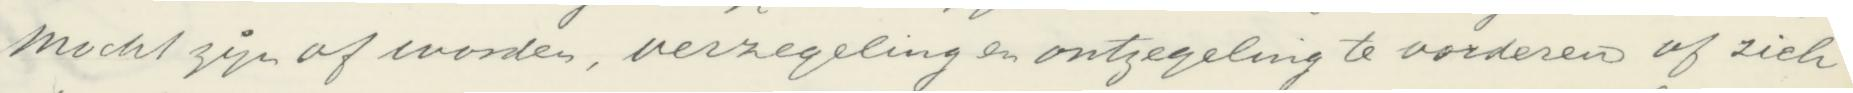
mocht zijn of worden, verzegeling en ontzegeling te vorderen of zich
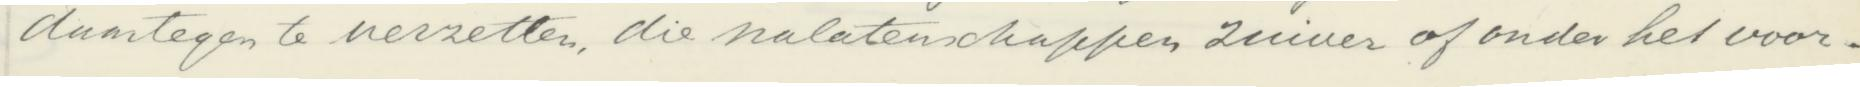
daartegen te verzetten, die nalatenschappen zuiver of onder het voor
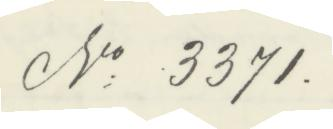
N=o 3371.
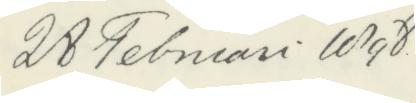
28 Februari 1898
